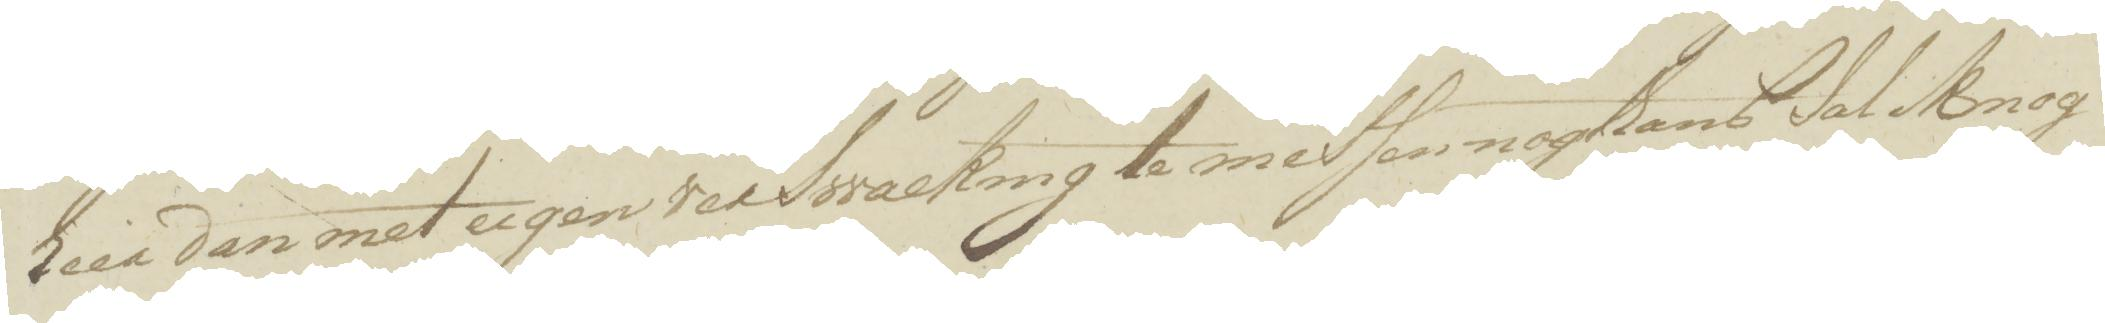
hier dan met eigen verswacking te missen nogthans sal ik nog
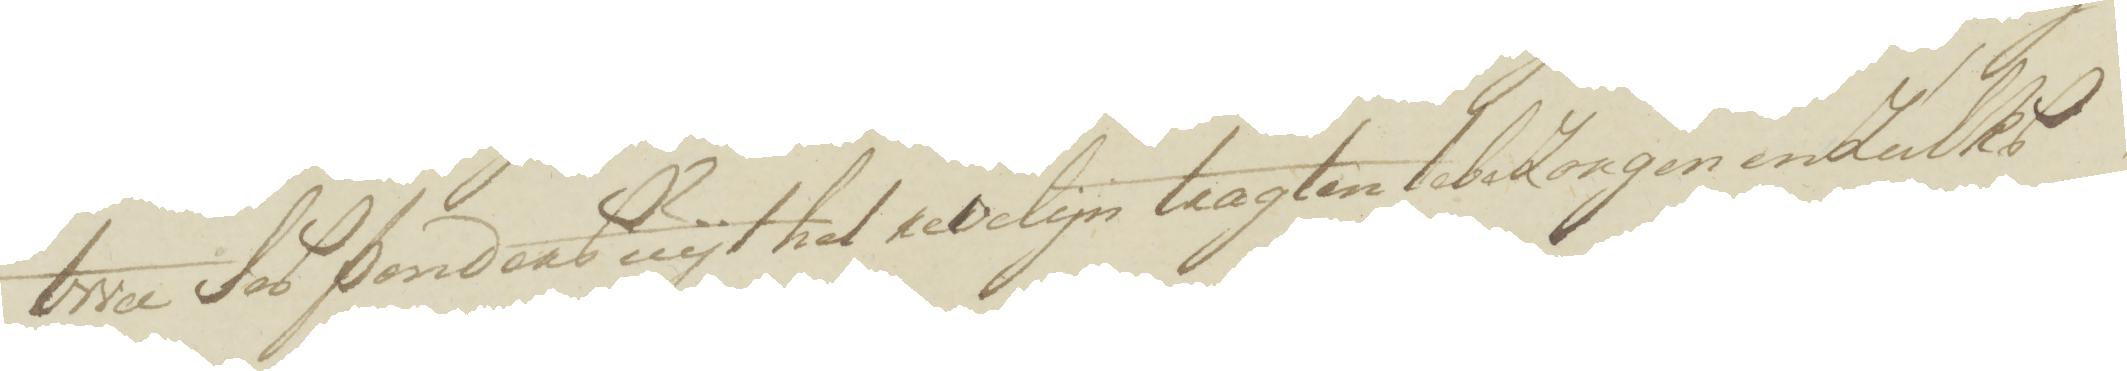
twee ses ponders uijt het revelijn tragten te bezorgen en zulks
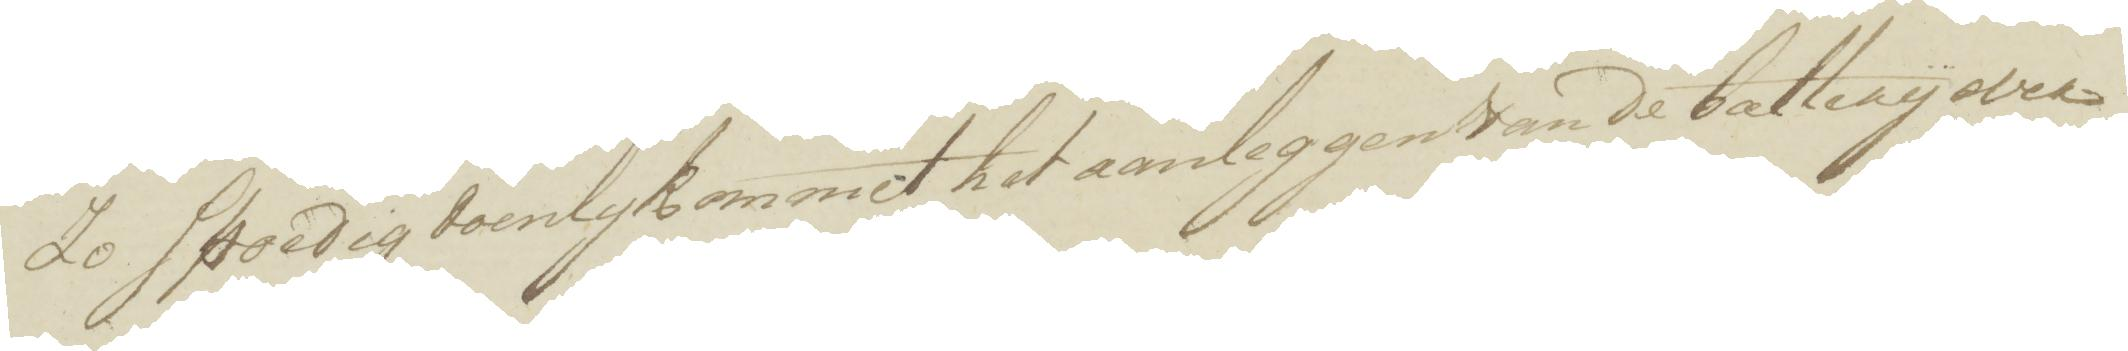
zo spoedig doenlyk om met het aanleggen van de batterij over
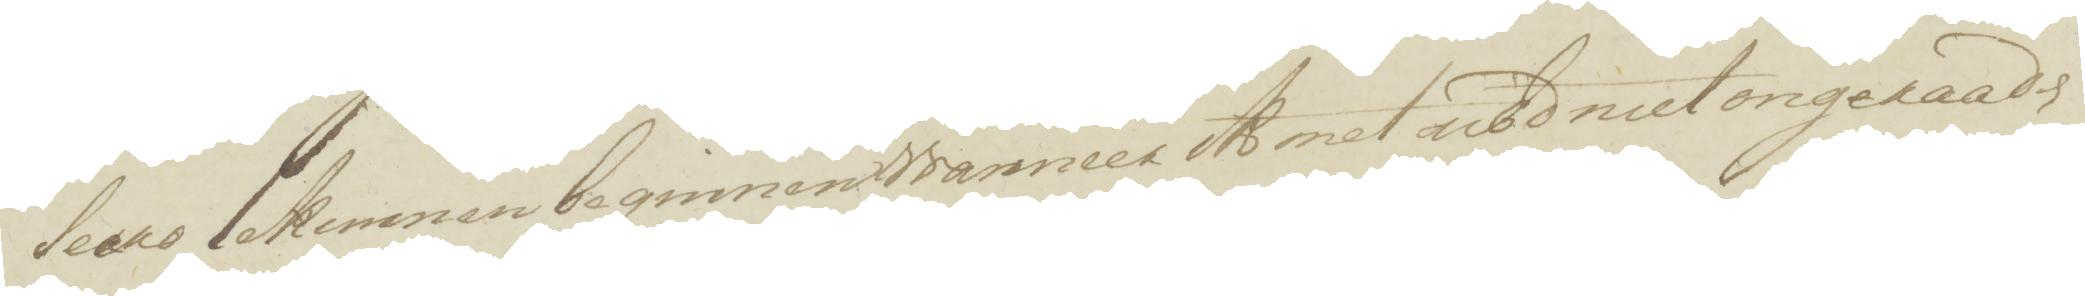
seere te kunnen beginnen wanneer ik met uEd niet ongeraaden
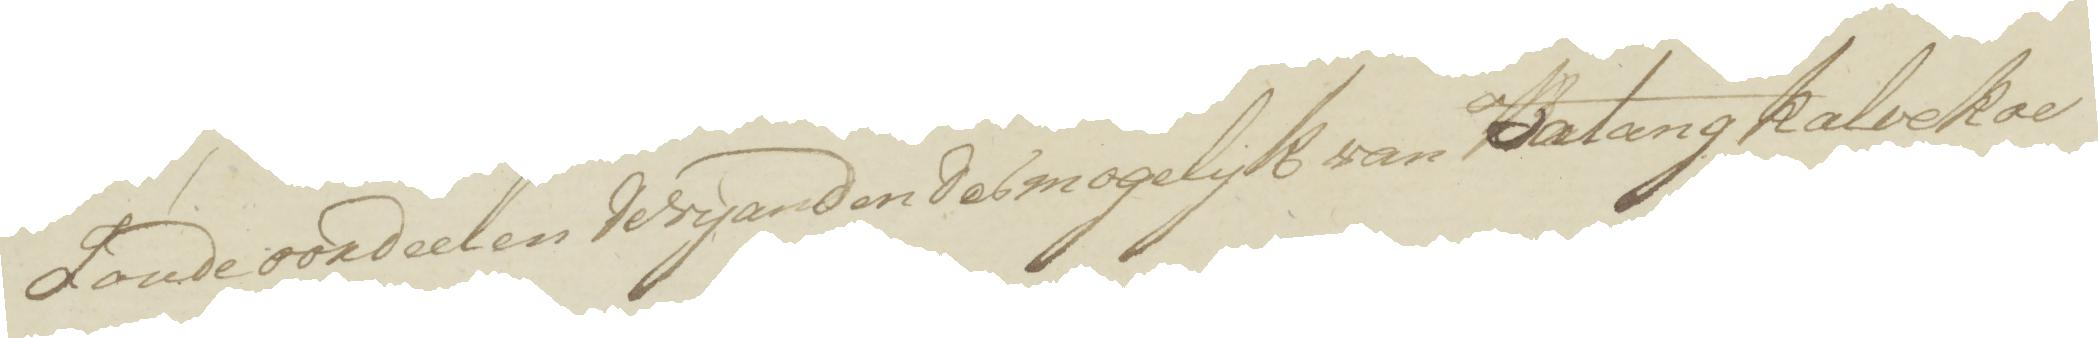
zoude oordeelen de vijanden des mogelijk van Batang kalvekoe
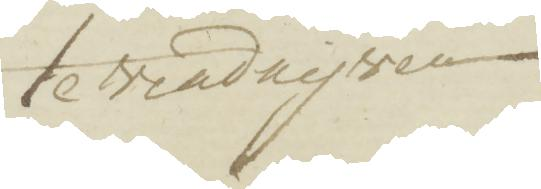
te verdrijven
